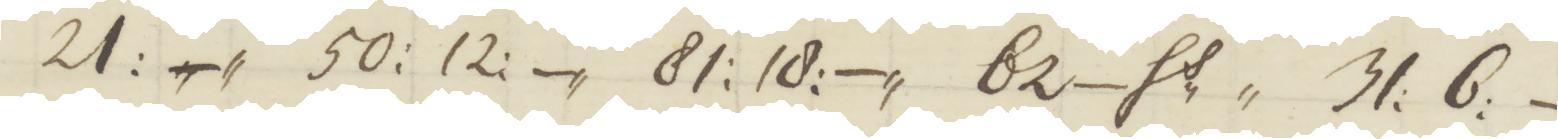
21:—„ 50: 12:—„ 81:18:—„ 62—s„s „ 31: 6: —
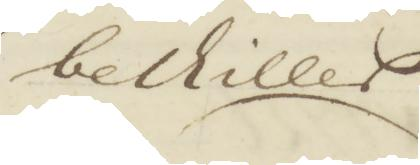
bethilles
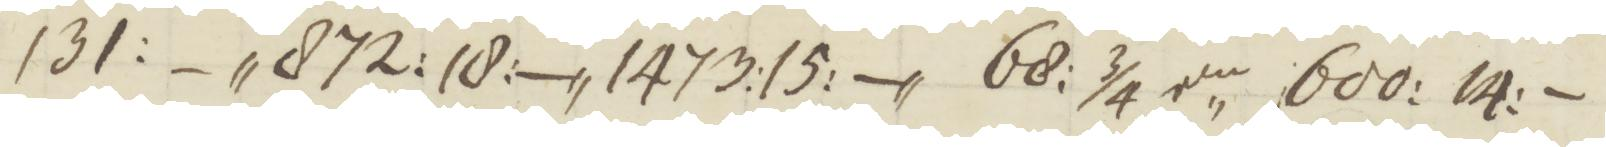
131:—„872:18:—„ 1473:15:—„. 68:¾ r„m 600: 14:—
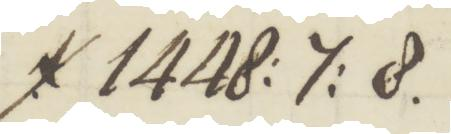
ƒ 1448:7:8.
